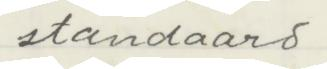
standaard
